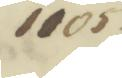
1105
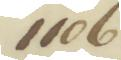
1106
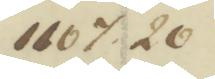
1107. 20
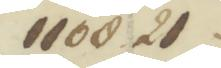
1108. 21
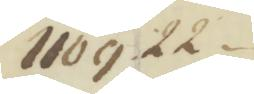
1109. 22.
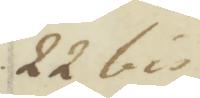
22 bis
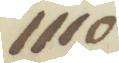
1110
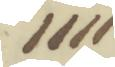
1111
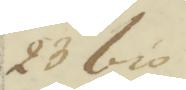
23 bis
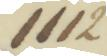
1112
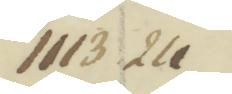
1113. 24
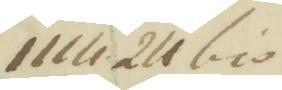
1114. 24 bis
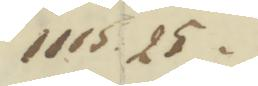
1115. 25 .
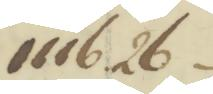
1116. 26.
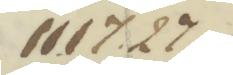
1117. 27 -
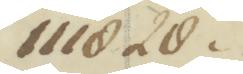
1118 28.
